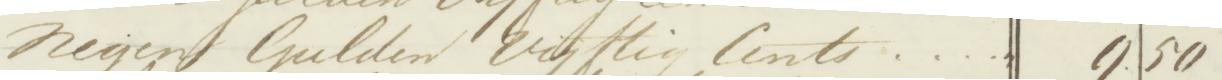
Negen Gulden vijftig Cents . . . . „ 9.50
